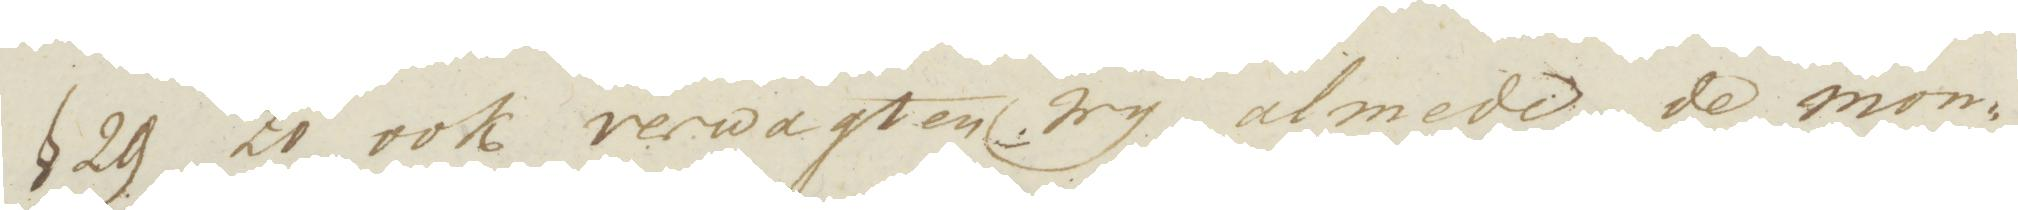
§ 29 zo ook verwagten , wij almede de mon„
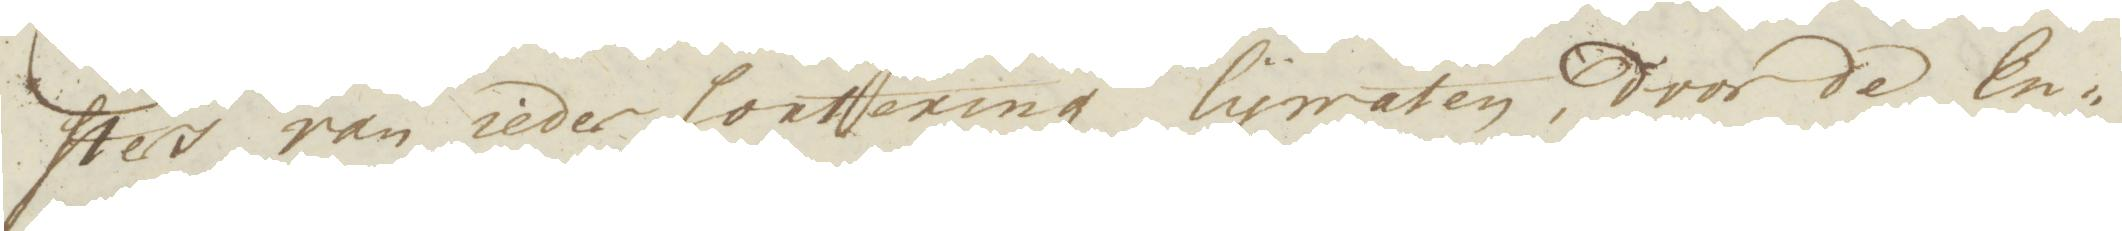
ster van ieder sortering lijwaten, door de En„
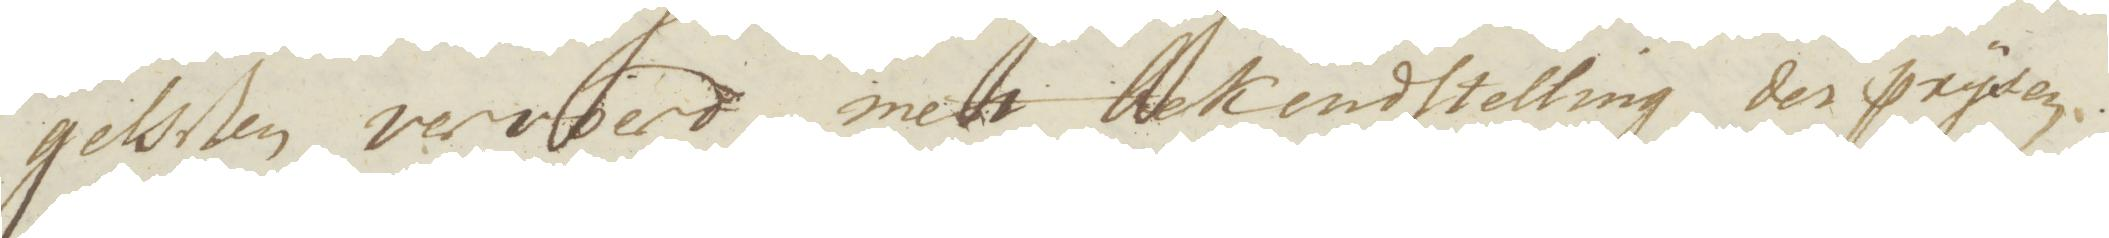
gelschen vervoerd met bekendstelling der prijsen
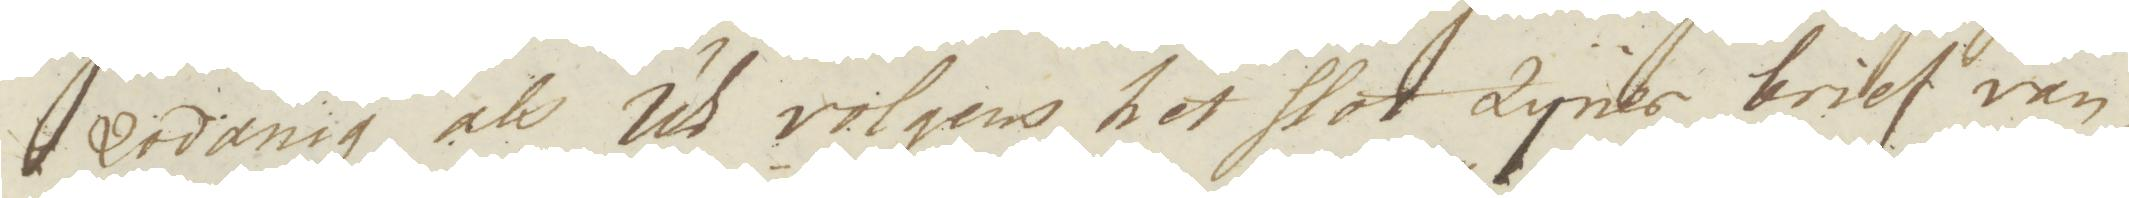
zodanig als uE volgens het slot zijner brief van
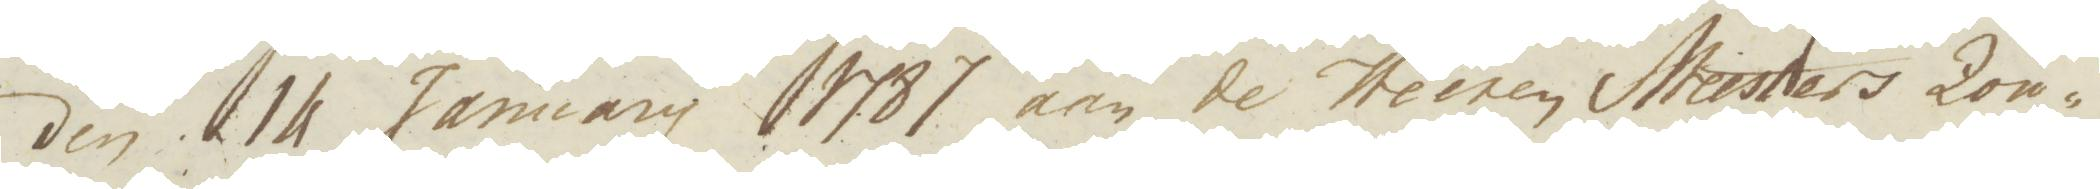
den 14 January 1787 aan de Heeren Meesters zou„
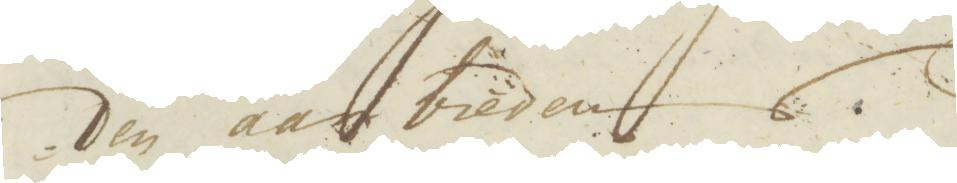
„den aan bieden.
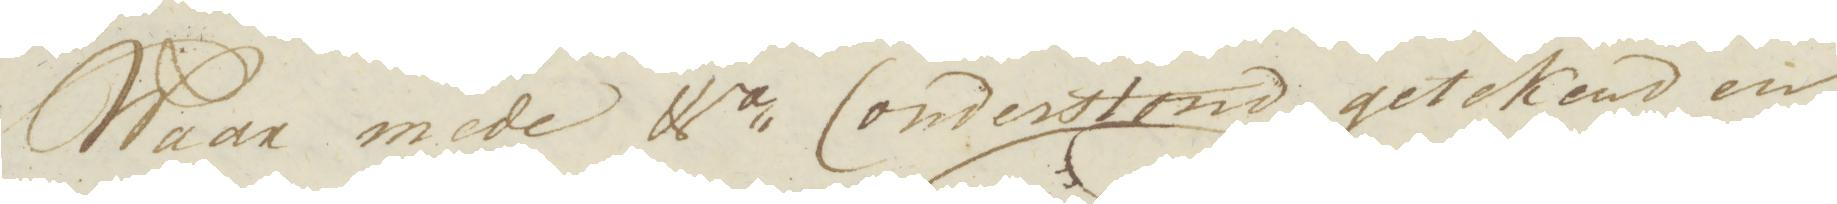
Waar mede &„a (onderstond getekend en
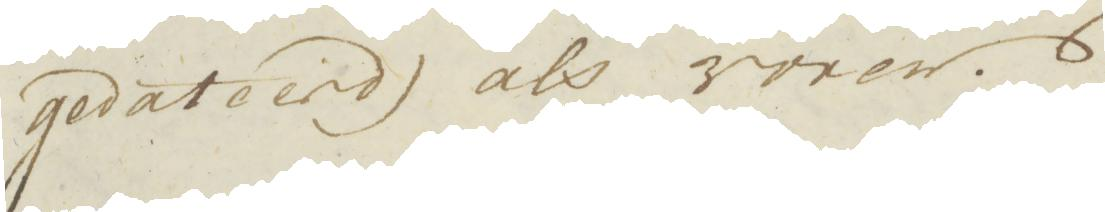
gedateerd) als voren.
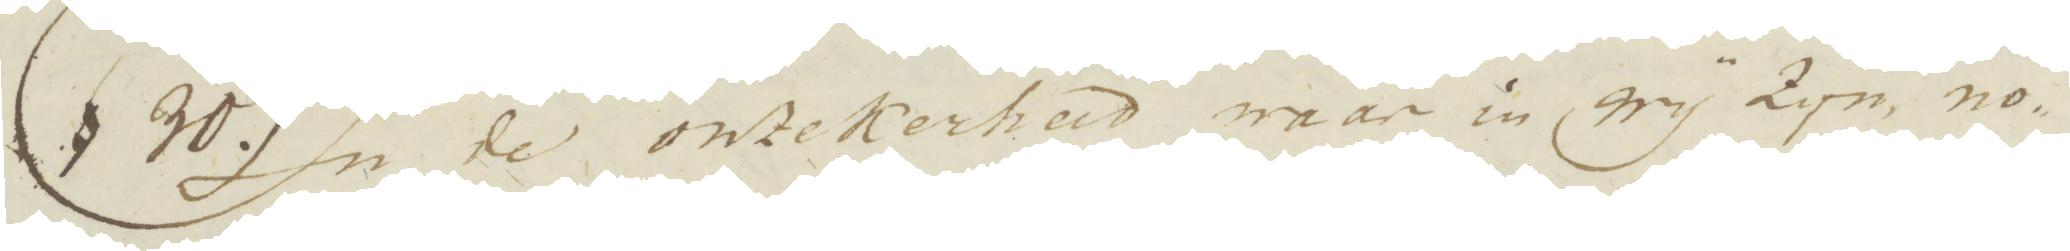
§ 30. In de onzekerheid waar in wij zyn, no„
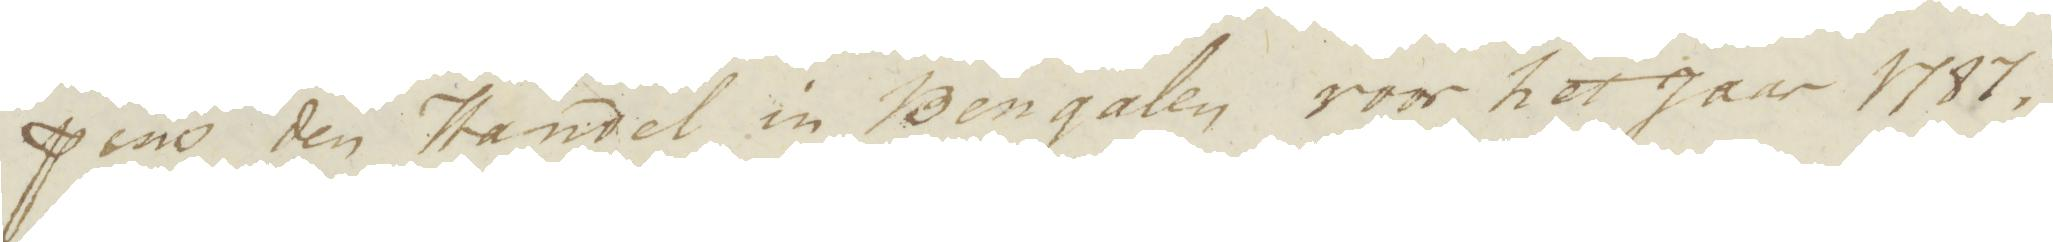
pens den Handel in Bengalen voor het jaar 1787,
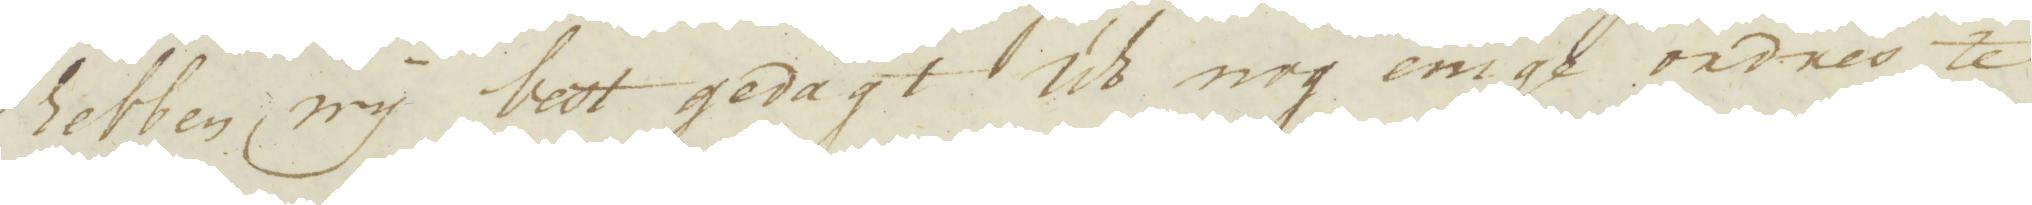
hebben wij best gedagt uE nog enige ordres te
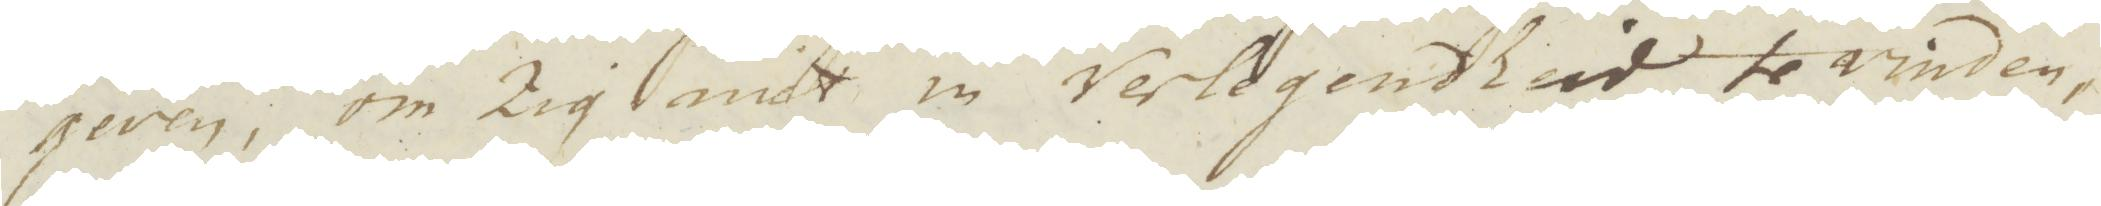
geven, om zig niet in verlegendheid te vinden„
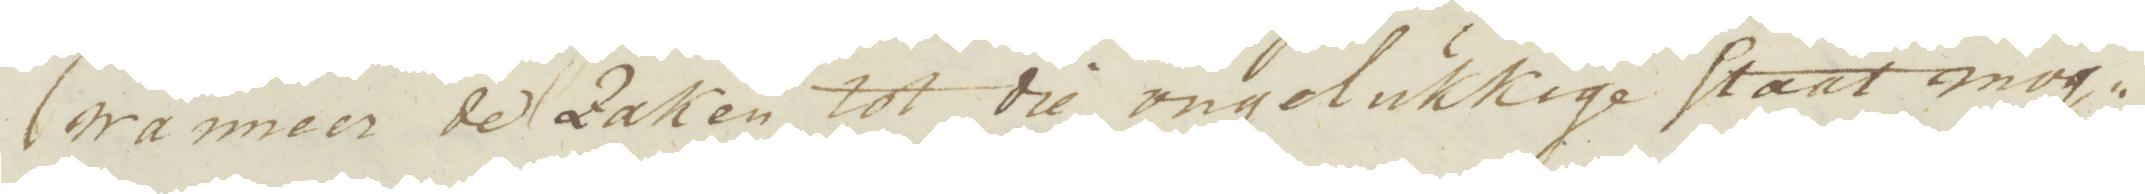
wanneer de zaken tot die ongelukkige staat mog„
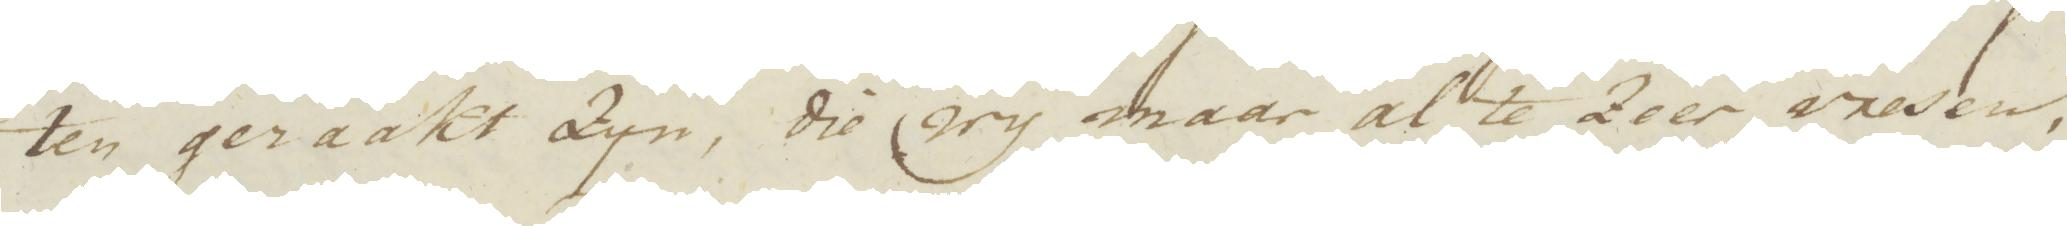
ten geraakt zyn, die wy maar al te zeer vresen,
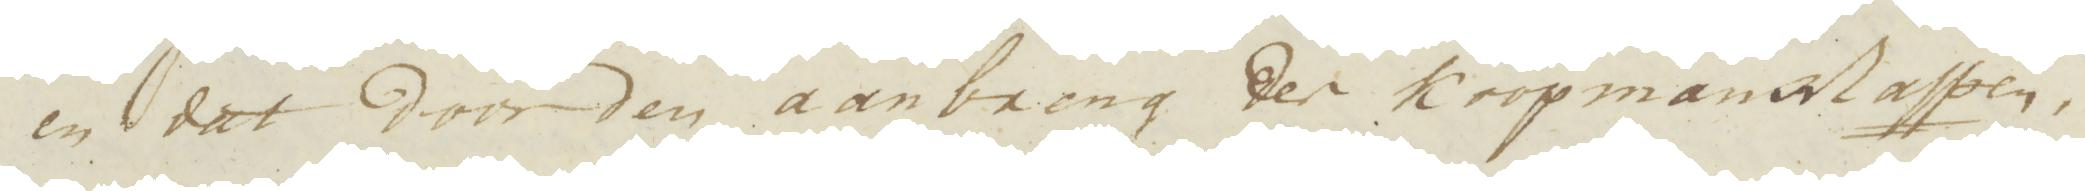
en dat door den aanbreng der Koopmanschappen,
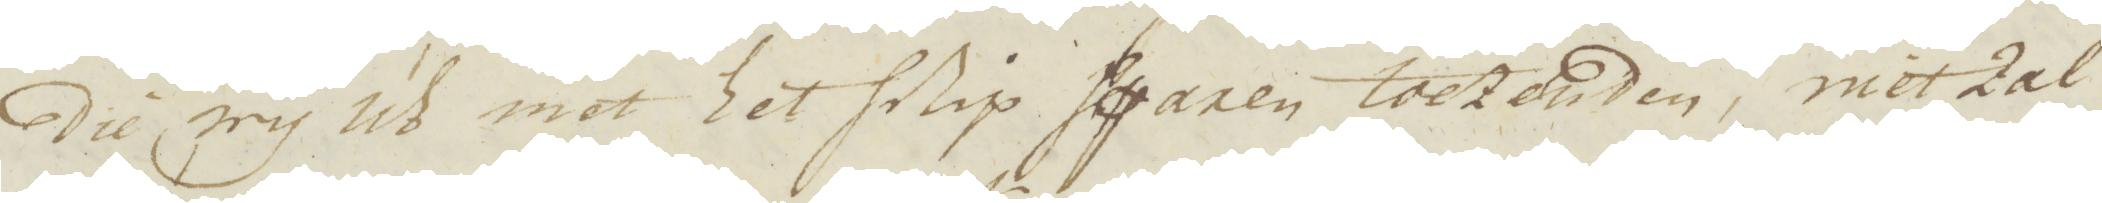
die wy uE met het schip sparen toezenden, niet zal
